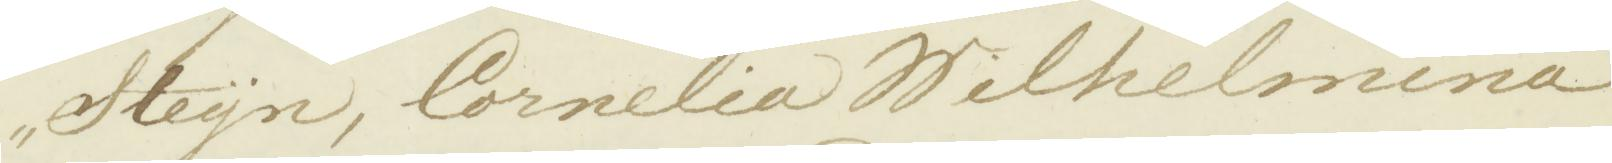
„steijn, Cornelia Wilhelmina
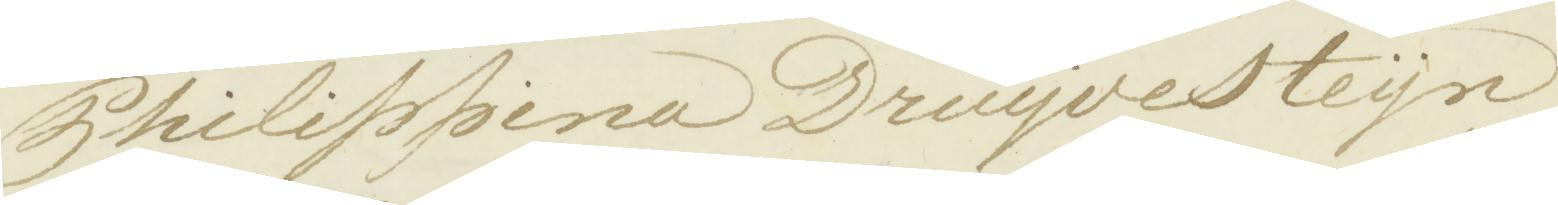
Philippina Druijvesteijn,
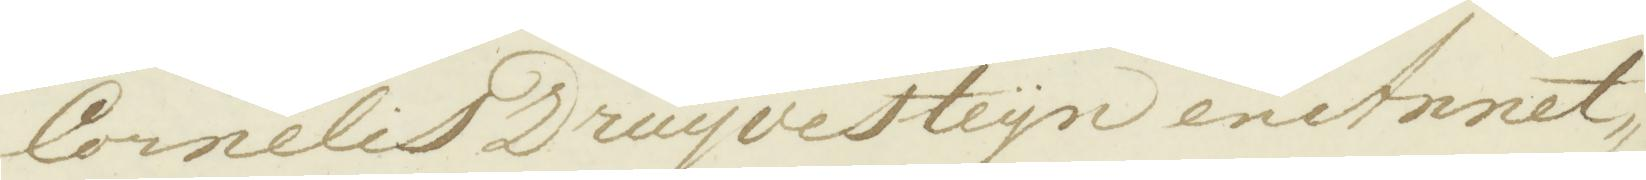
Cornelis Druijvesteijn en Annet„
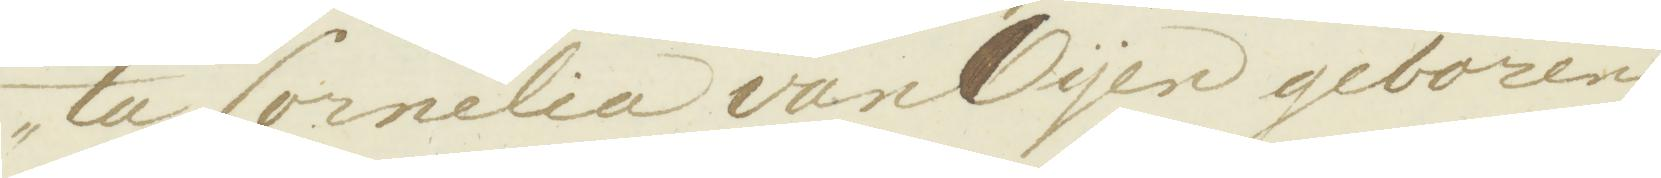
„ta Cornelia van Oijen geboren
